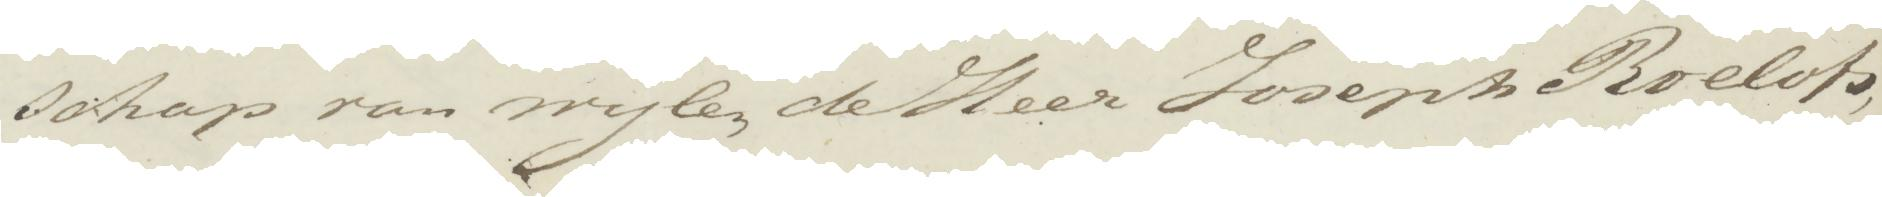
schap van wylen de Heer Joseph Roelofs,
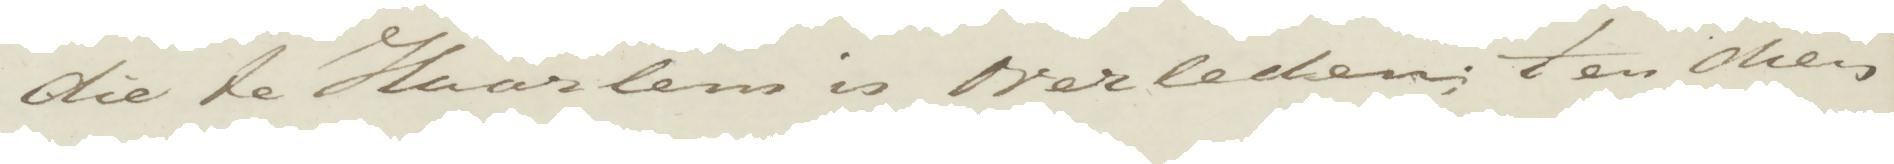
die te Haarlem is overleden; ten dien
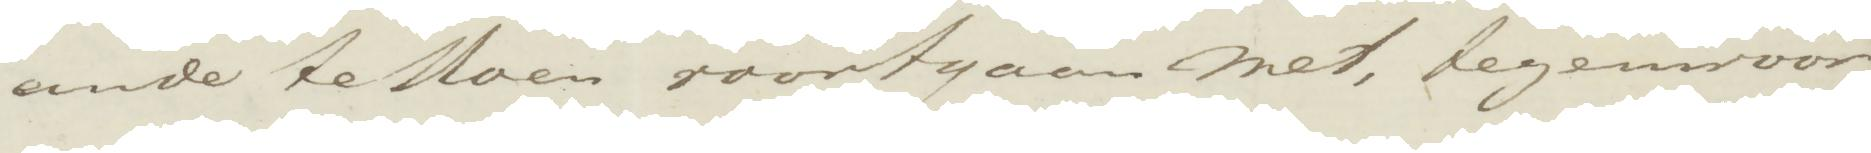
einde te doen voortgaan met, tegenwoor
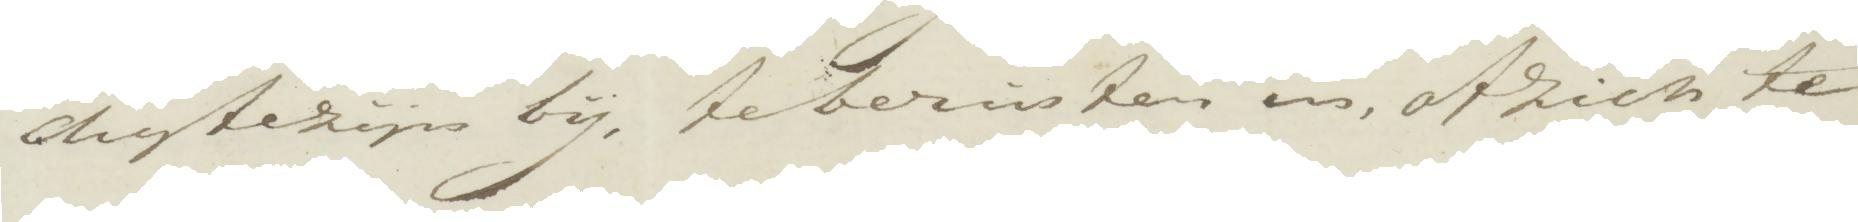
dig te zijn bij, te berusten in, of zien te
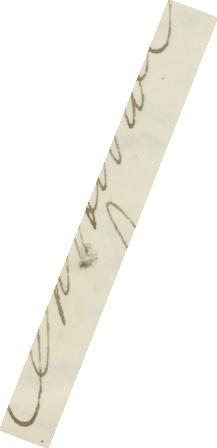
Eerstichel
